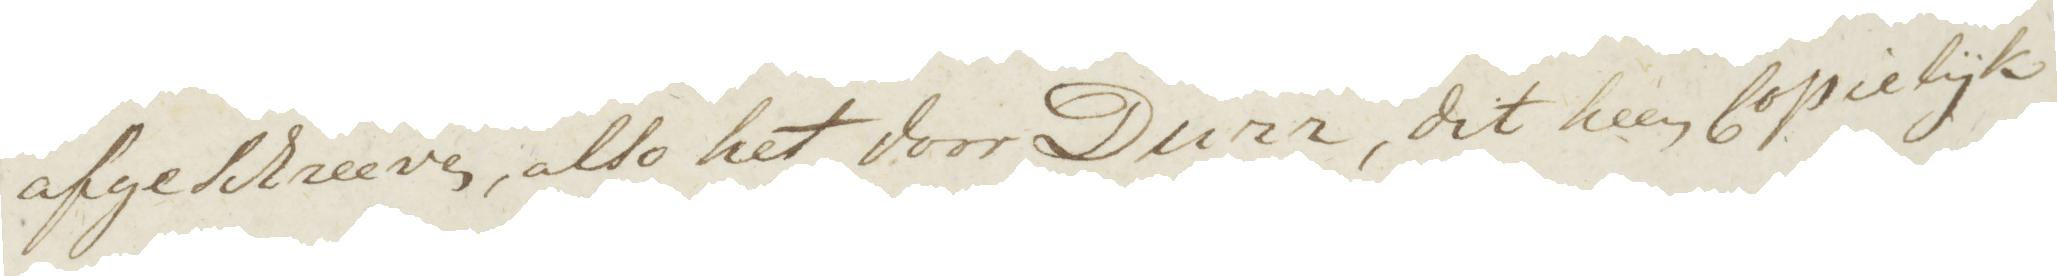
afgeschreeven; also het door Durr, dit heen copielijk
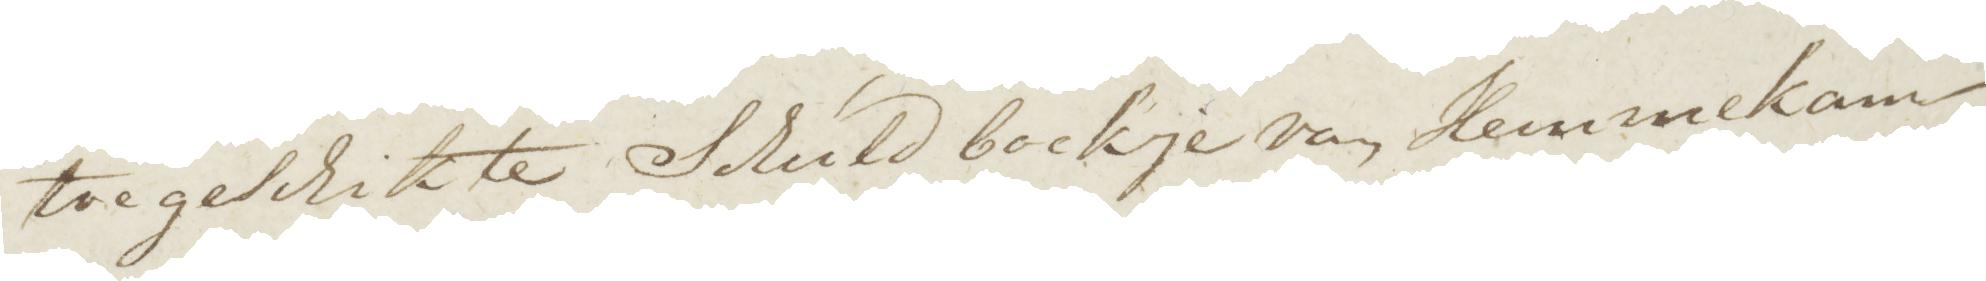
toe geschikte Schuld boekje van Hemmekam
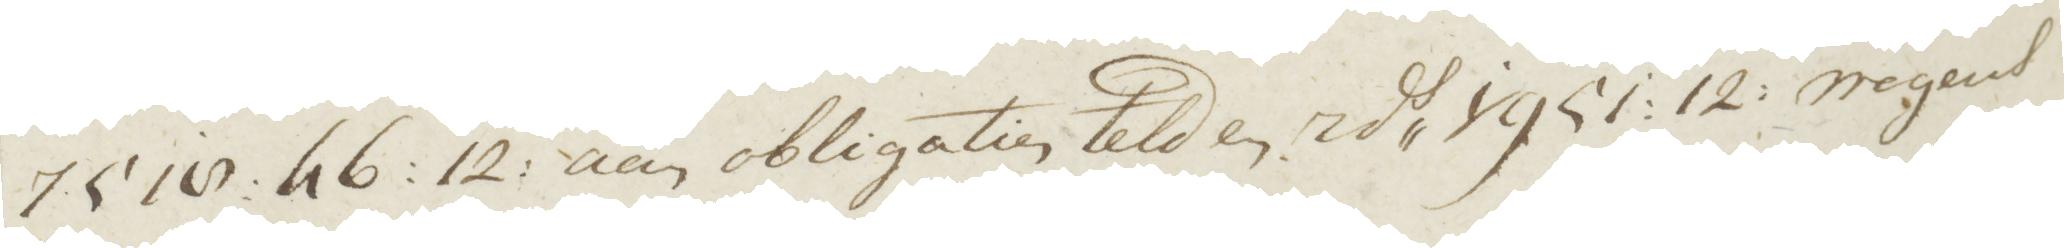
7518: 46 : 12: aan obligatien telden rd„s 1951: 12: wegens
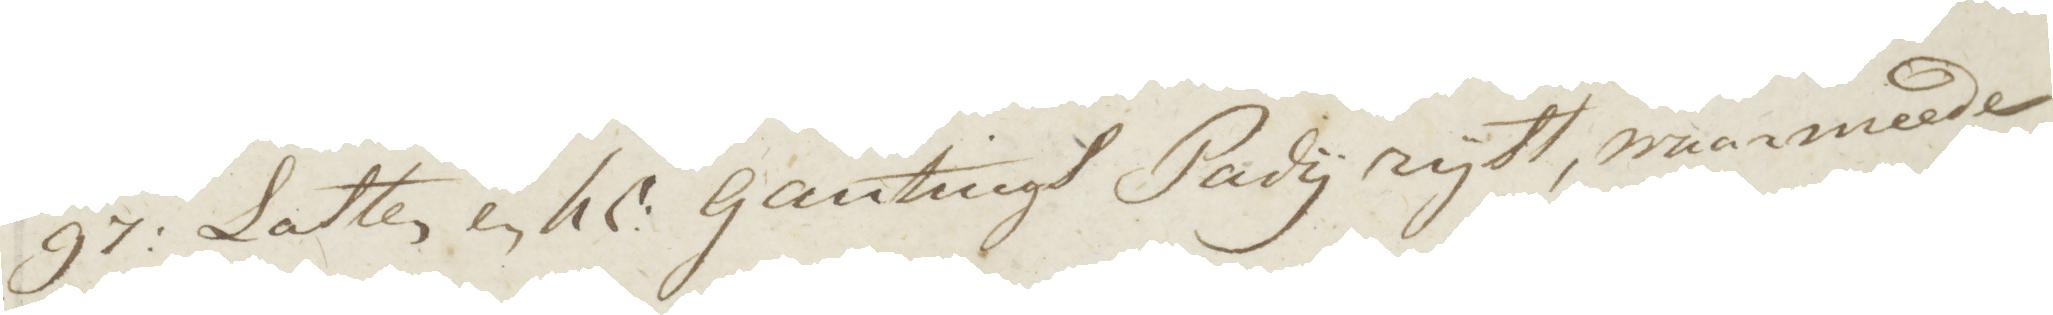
97: Lasten en 45: gantings Padij rijst, waarmeede
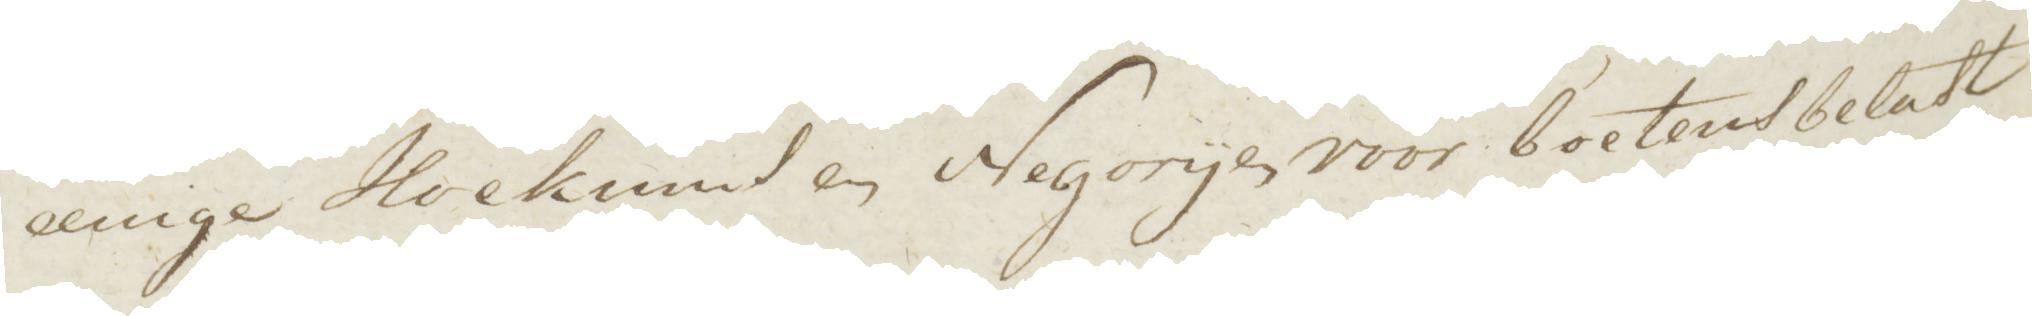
eenige Hoekums en Negorijen voor boetens belast
